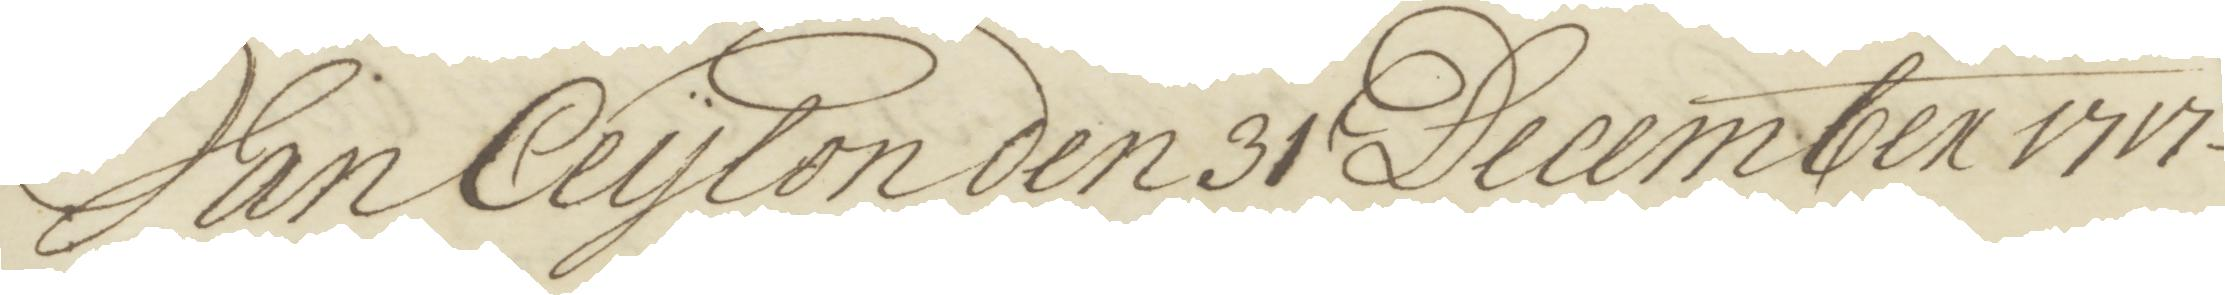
Van Ceijlon den 31 December 1717
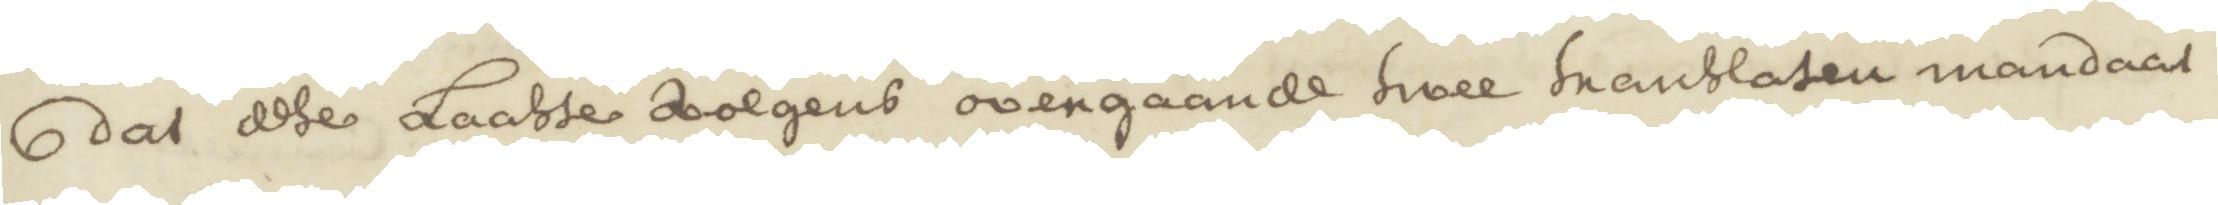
dat dese Laaste volgens overgaande twee translaten mandaat
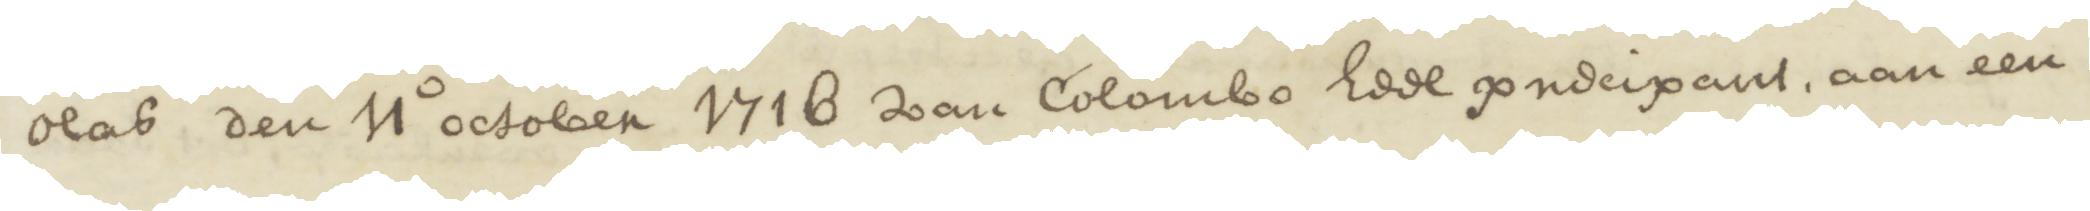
olas den 11o october 1716 van Colombo heel precipant, aan een
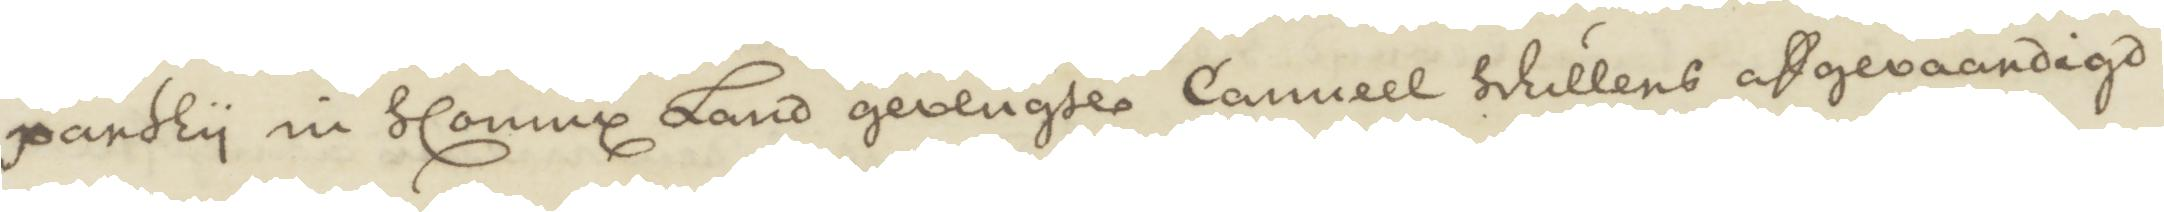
parthij in sConinx Land gevlugte Canneel schillens afgevaardigd
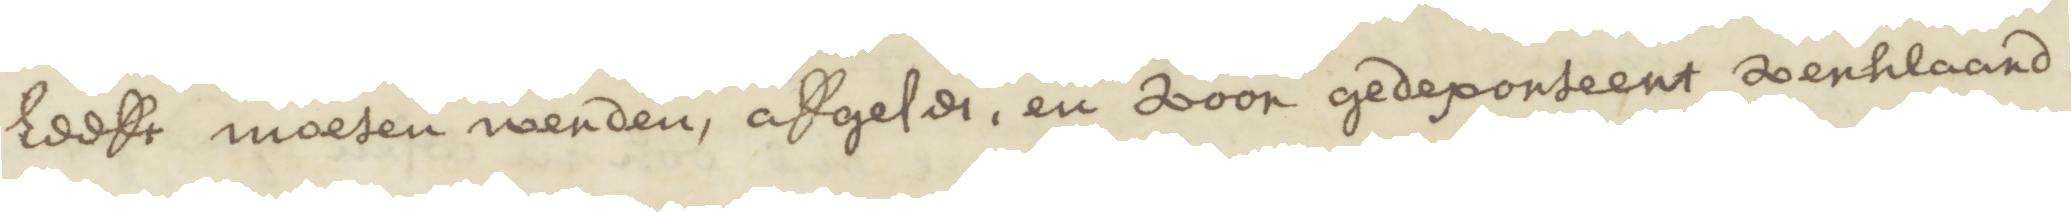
heeft moeten werden, afgeset, en voor gedeporteert verklaard
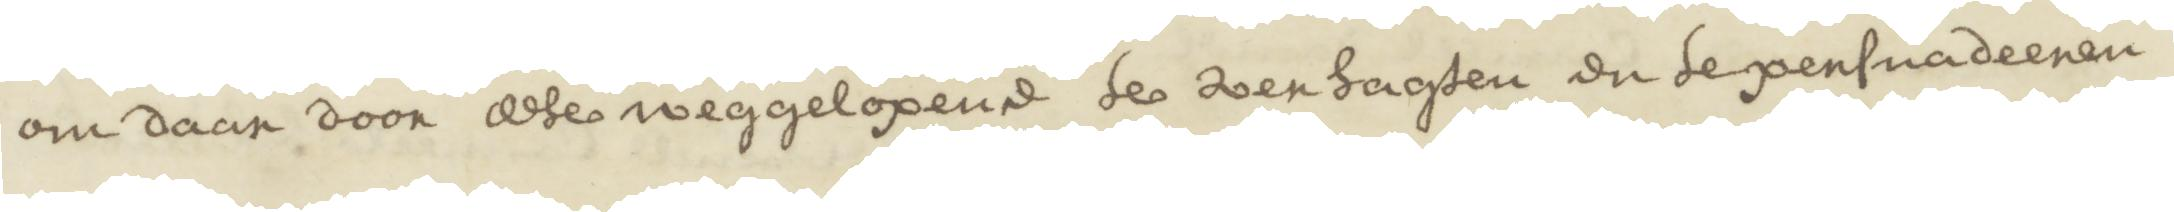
om daar door dese weggelopene te versagten en te persuadeeren
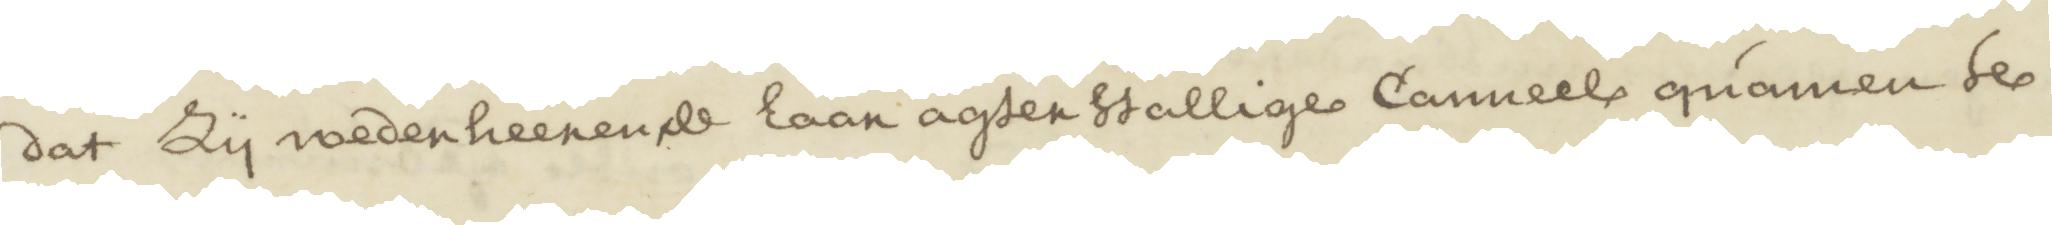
dat zij wederkeeren, de haar agter stallige Canneel quamen te
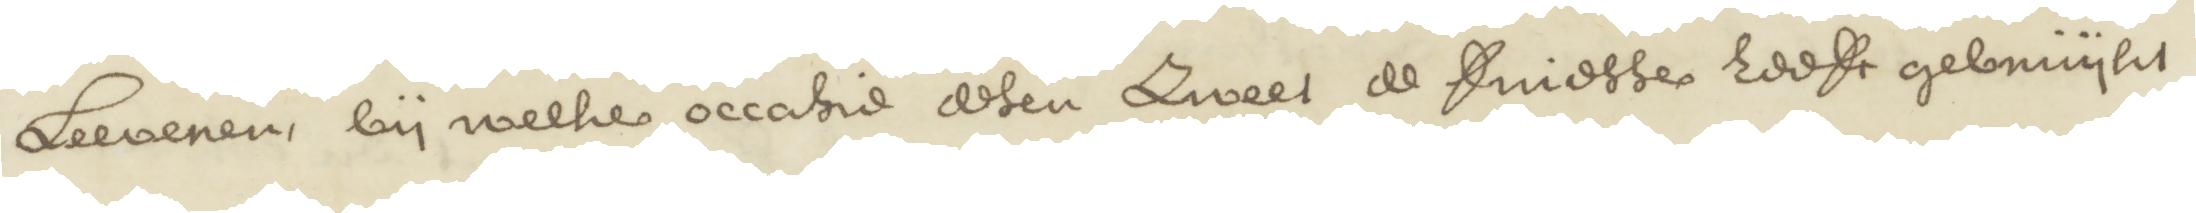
Leeveren, bij welke occasie desen zweet de verniesse heeft gebruijkt
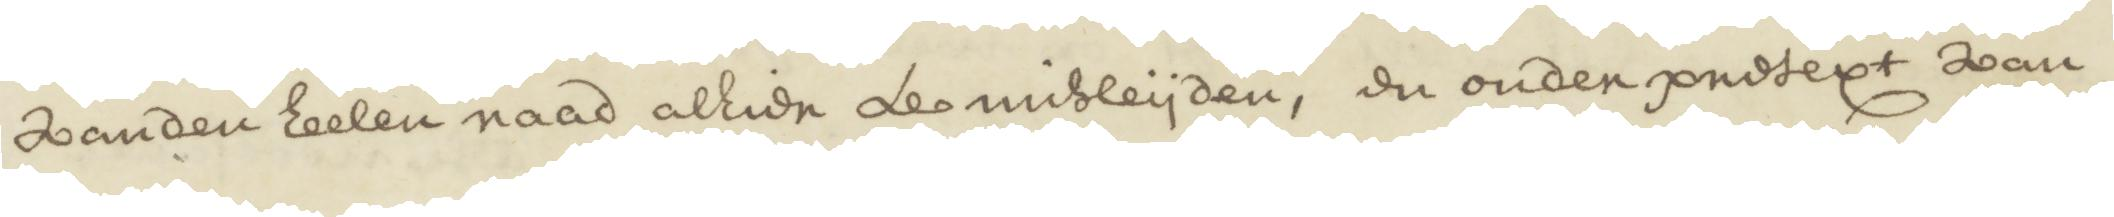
van den heelen raad alhier te misleijden, en onder pretext van
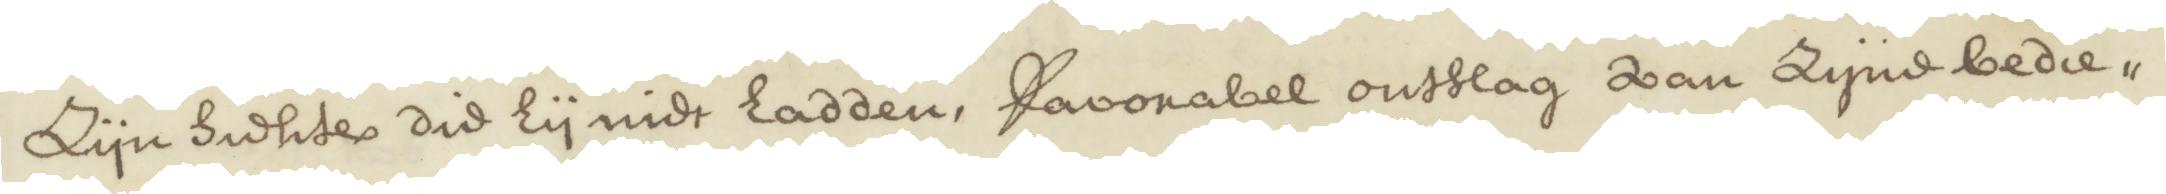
zijn siekte die hij niet hadden, favorabel ontslag van zijne bedie„
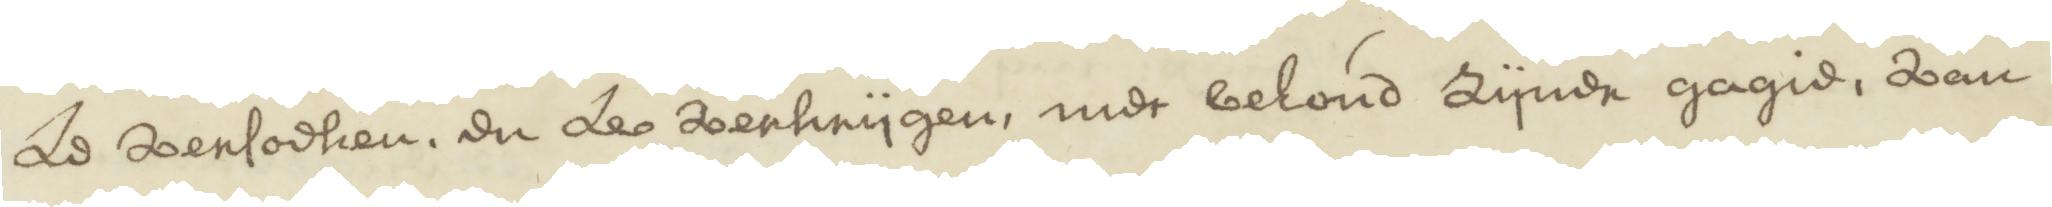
te versoeken, en te verkrijgen, met behoud zijner gagie, van
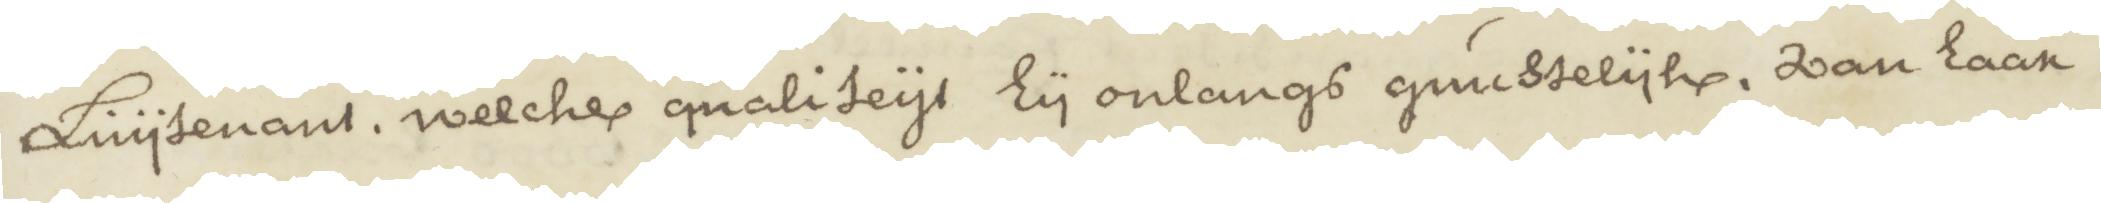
Luijtenant, welcke qualiteijt hij onlangs gunstelijk, van haar
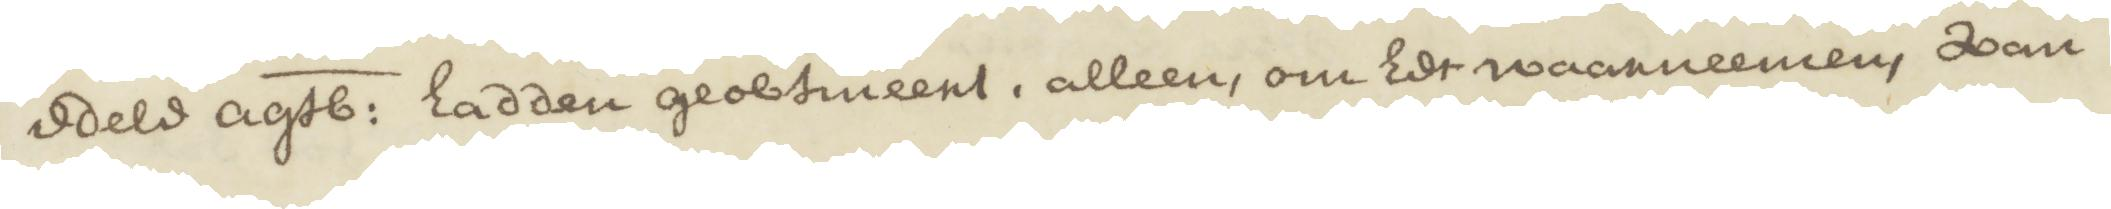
edele agtb: hadden geobtineert, alleen, om het waarneemen, van
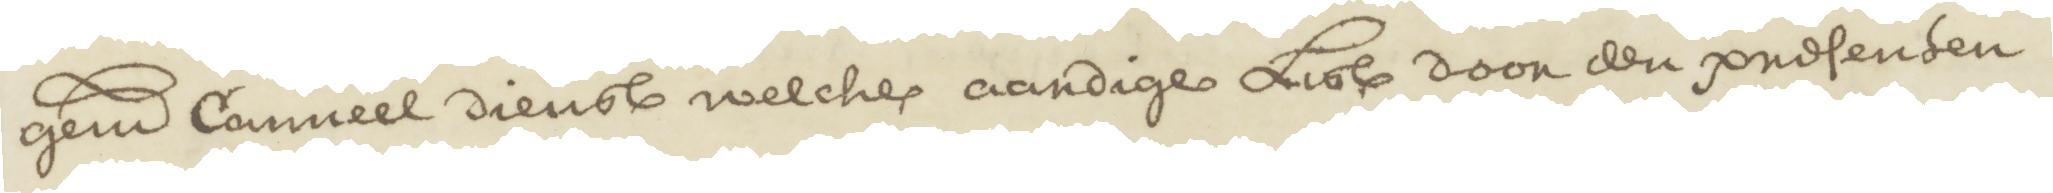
gem Canneel dienst welcke aardige List door den presenten
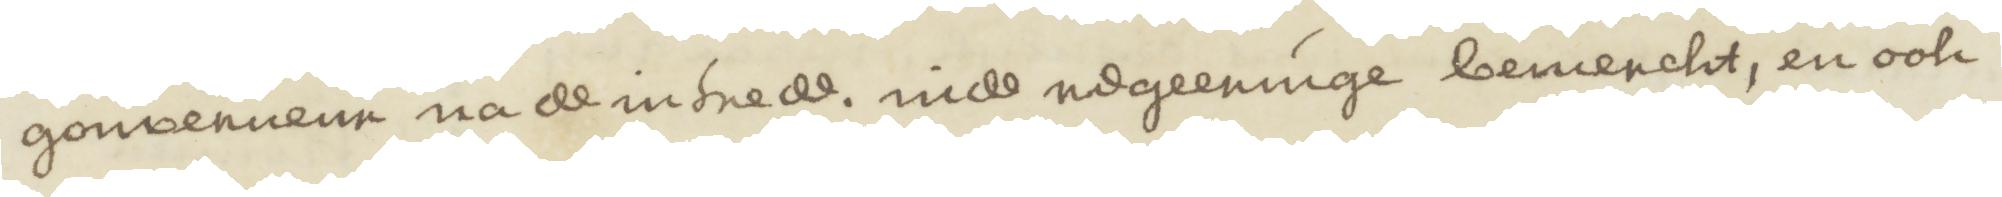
gouverneur na de intrede, inde regeeringe bemerckt, en ook
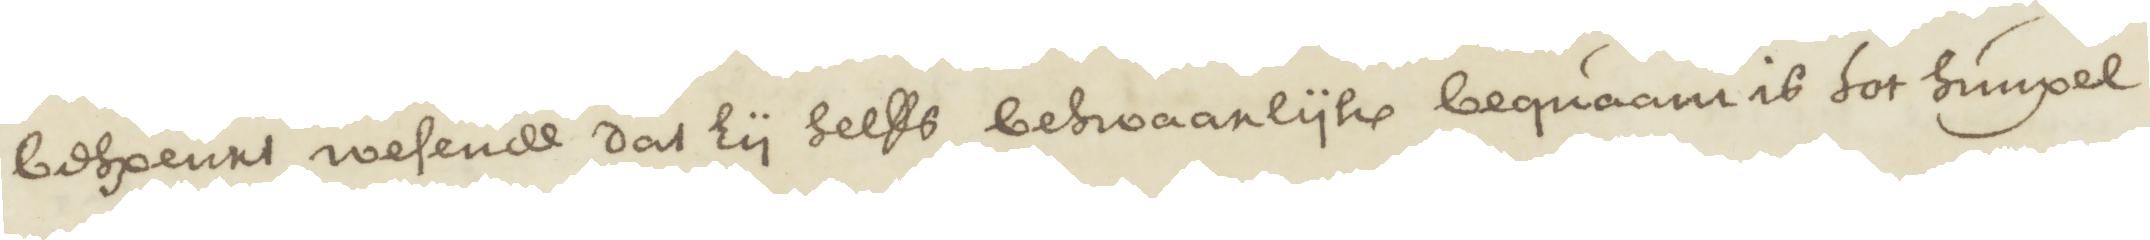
bespeurt wesende dat hij selfs beswaarlijk bequaam is tot simpel
